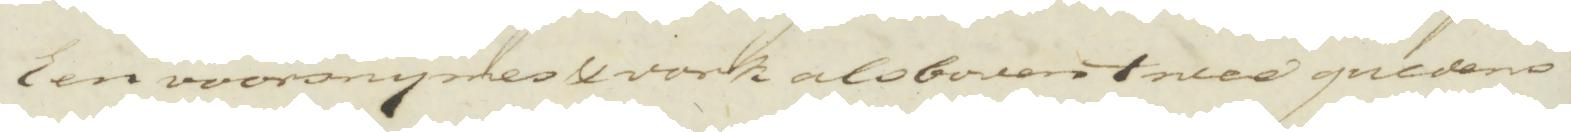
Een voorsnymes & vork als boven twee guldens
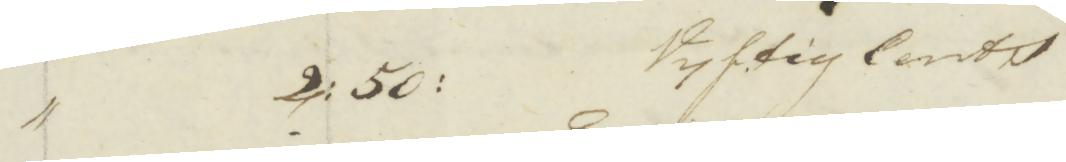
„ 2: 50: Vyftig Cents
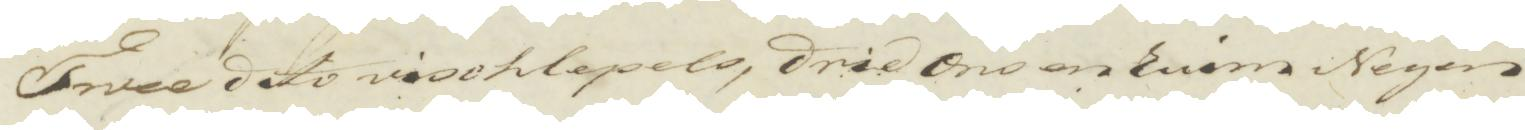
Twee dito vischlepels, drie ons en ruim Negen
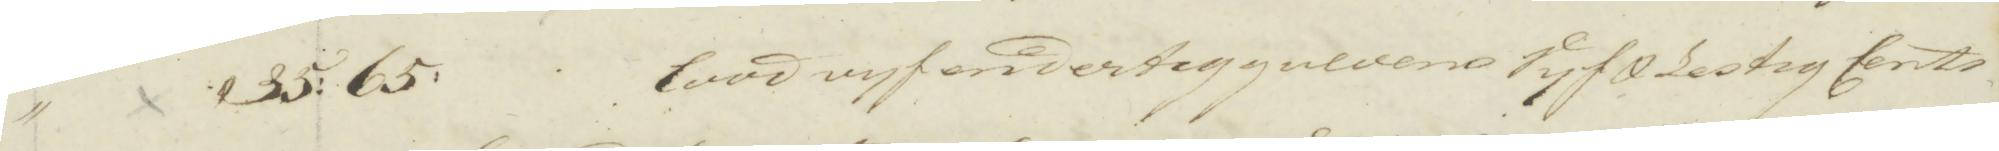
„ x „ 35: 65: lood vyf en dertig guldens vyf & zestig Cents
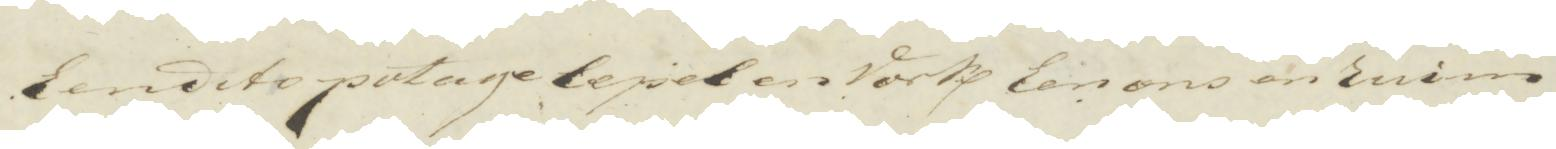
Een dito potage lepel en vork Een ons en ruim
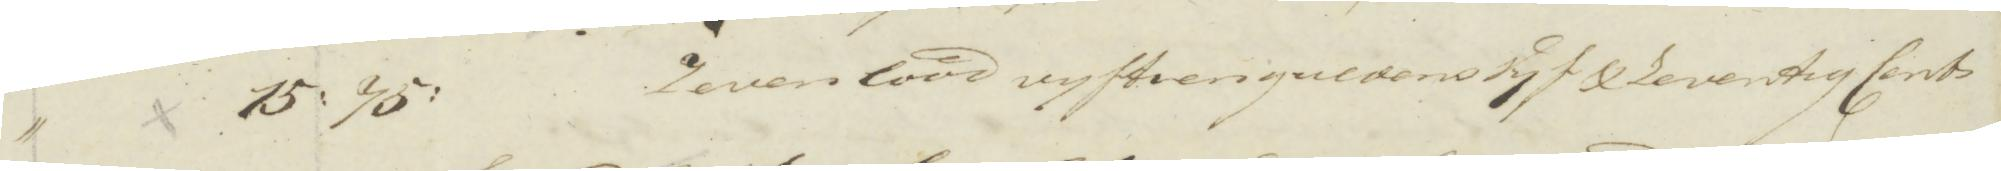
„ x 15: 75: zeven lood vyftien guldens vyf & zeventig Cents
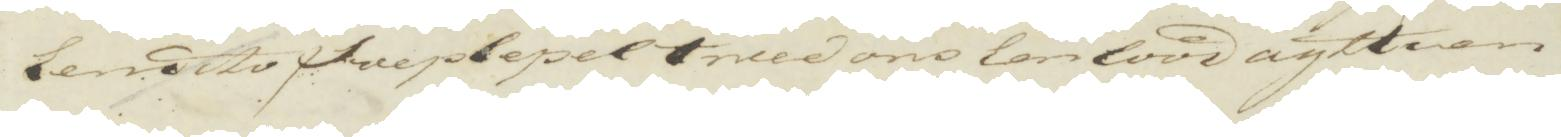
Een dito soeplepel twee ons Een lood agttien
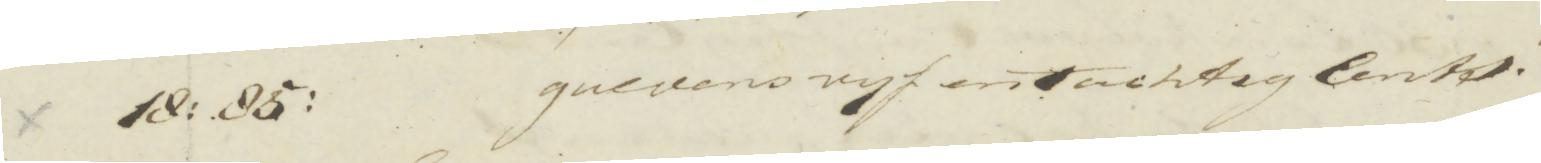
„ x 18: 85: guldens vyf en tachtig Cents.
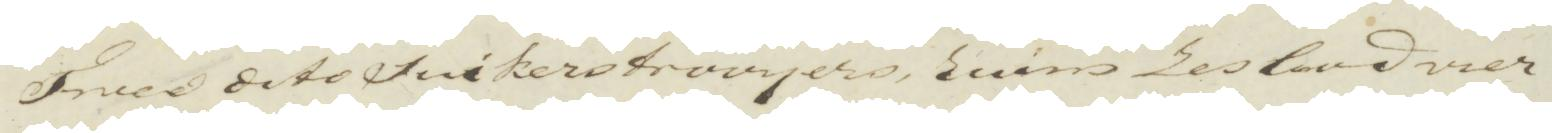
Twee dits suikerstrooyers, ruim zes lood vier
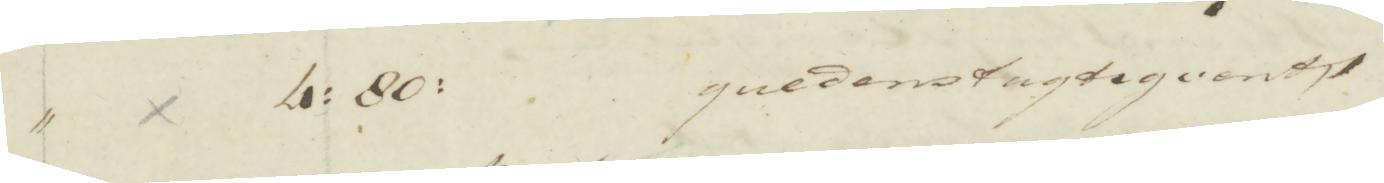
„ x 4: 80: guldens tagtig cents
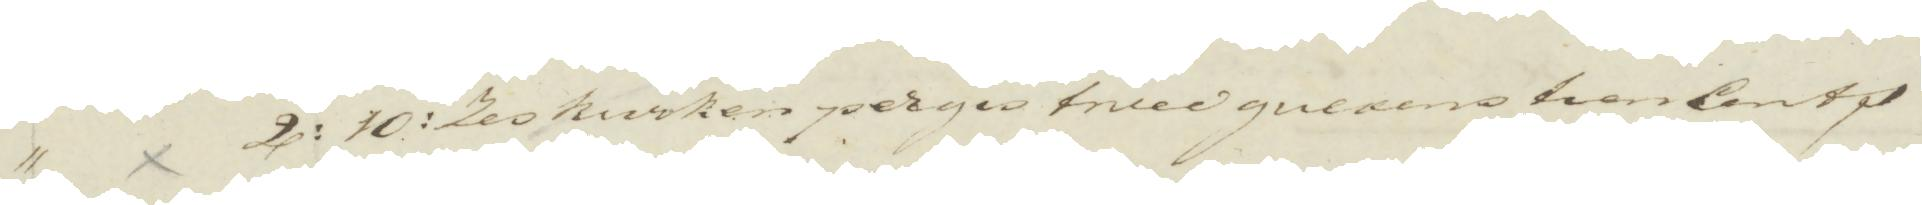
„ x 2: 10: zes kurken per gis twee guldens tien Cents
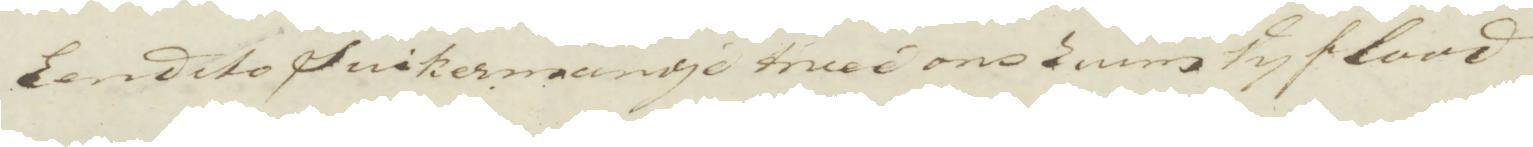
Een dito Suiker mandje twee ons ruim Vyf lood
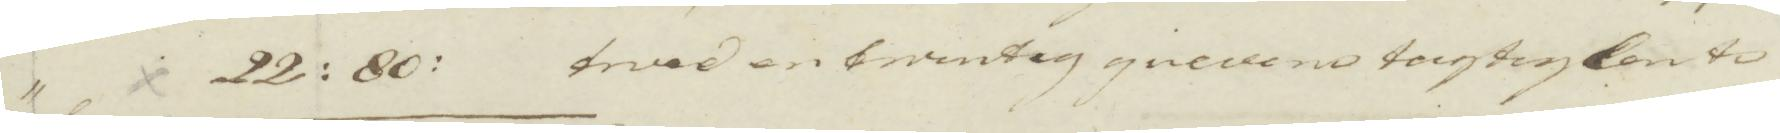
„ x 22: 80: twee en twintig guldens tagtig Cents
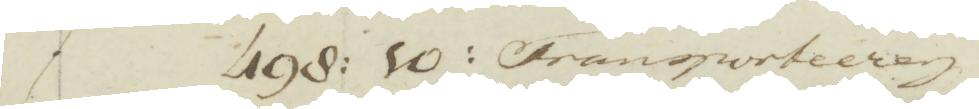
ƒ 498: 50 : Transporteeren
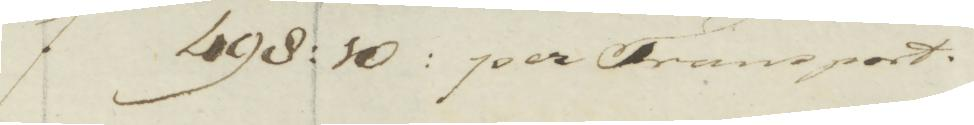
ƒ 498: 10: per Transport.
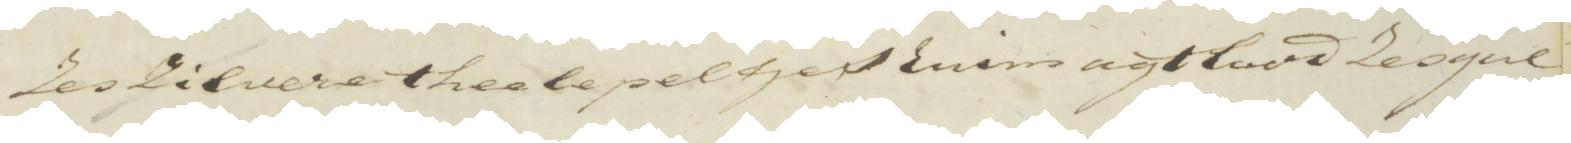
Zes zilvere theelepeltjes ruim agt lood Zes gul
